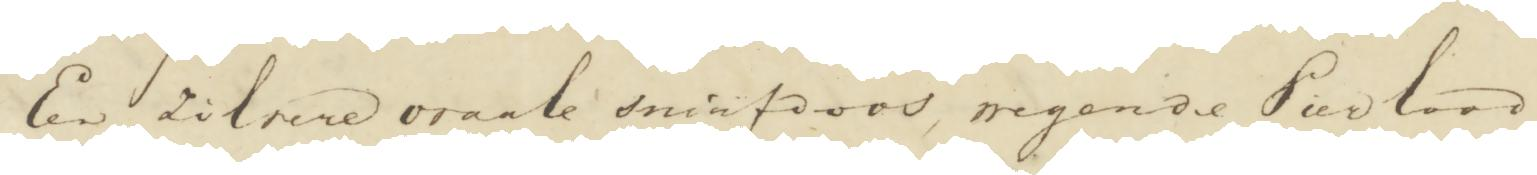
Een zilvere ovaale snuifdoos, wegende Vier lood
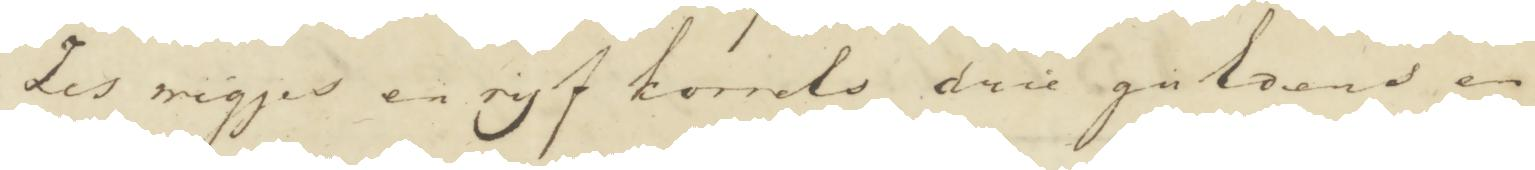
Zes wigjes en vijf korrels, drie guldens en
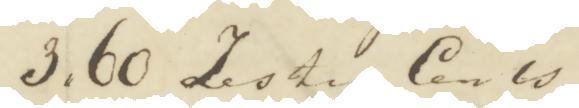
3„60 Zestig Cents
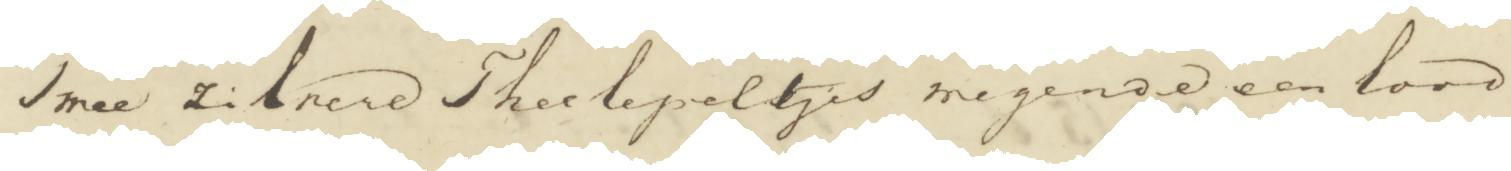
Twee zilvere Theelepeltjes wegende een lood
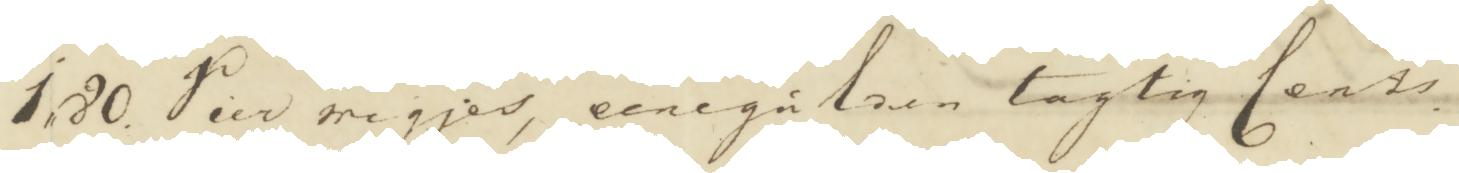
1„80. Vier wigjes, eene gulden tagtig Cents.
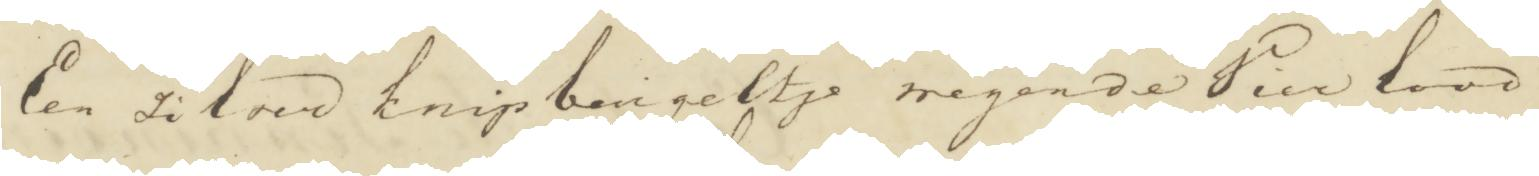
Een zilver knipbeugeltje wegende Vier lood
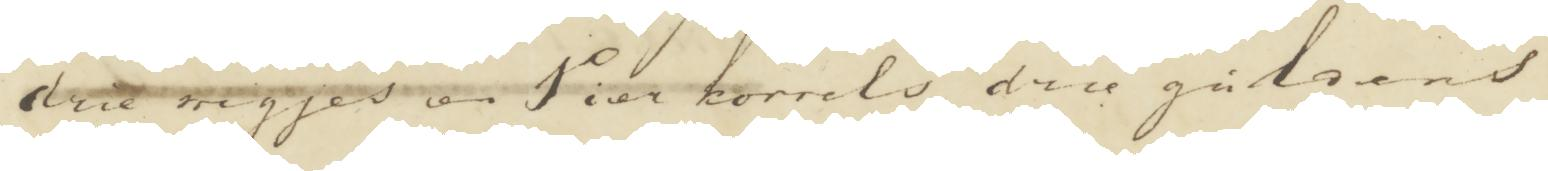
drie wigjes en Vier korrels, drie guldens
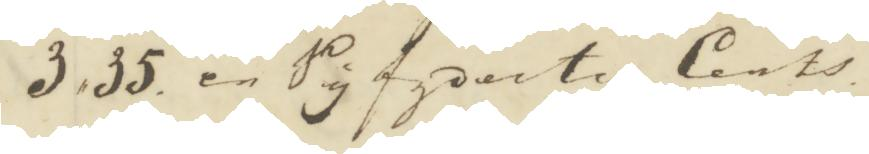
3„35. en Vijfendertig Cents.
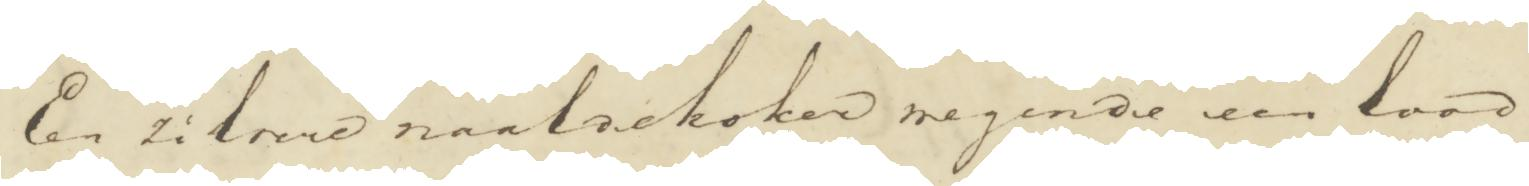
Een zilvere naaldekoker wegende een lood
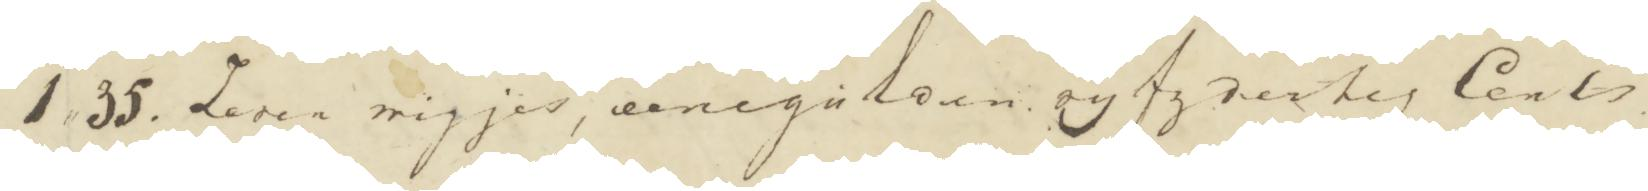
1„35. Zeven wigjes, eene gulden vyfendertig Cents
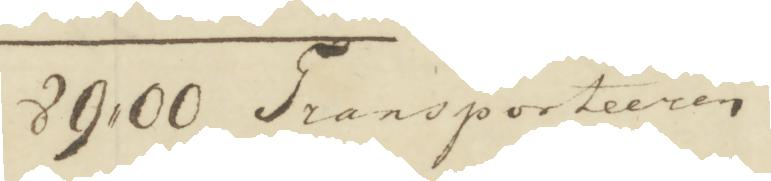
89„00 Transporteeren
